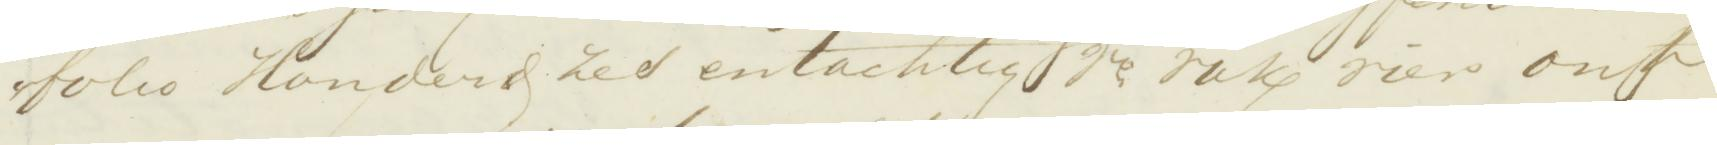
„folio Honderd zes en tachtig v„o vak vier ont
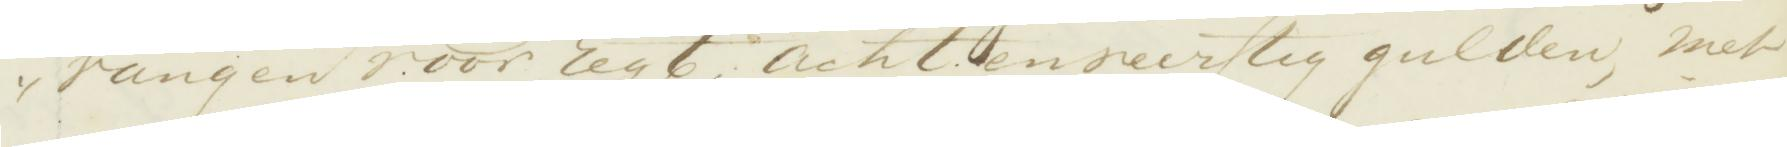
„vangen voor regt, acht en veertig gulden, met
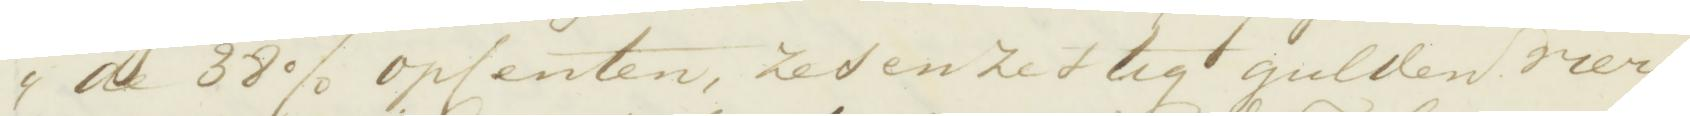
„de 38% opCenten, zes en zestig gulden vier
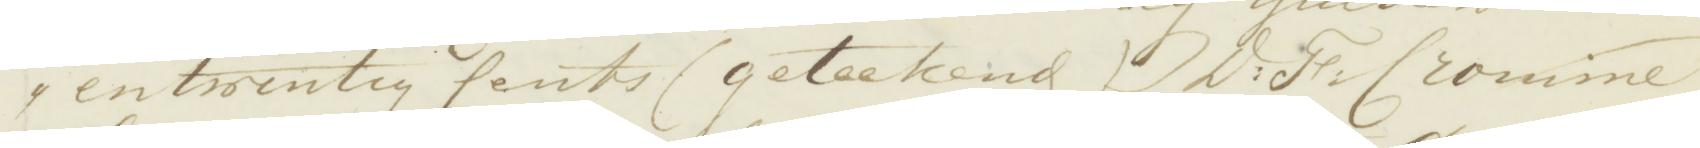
„ en twintig Cents (geteekend) D: F: Cromme
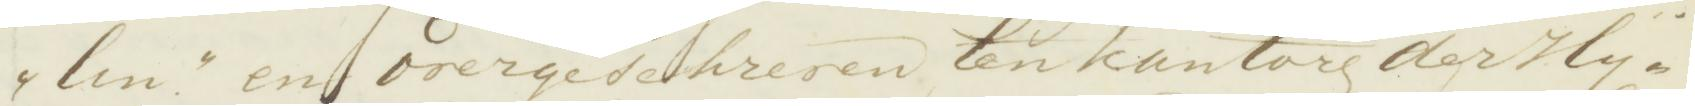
„lin en overgeschreven ten kantore der Hij„
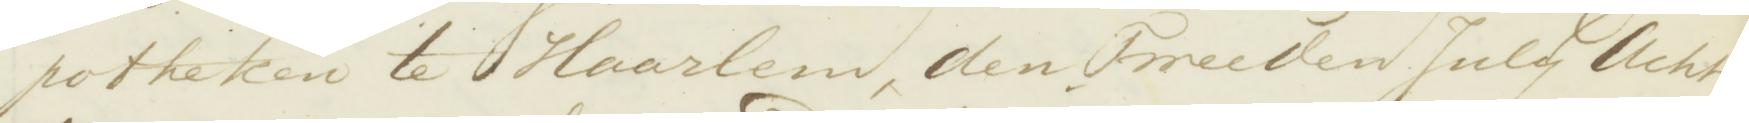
potheken te Haarlem, den Tweeden July Acht
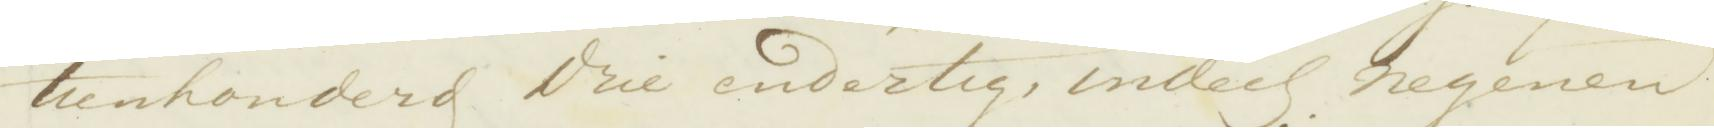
tienhonderd drie en dertig, in deel negenen
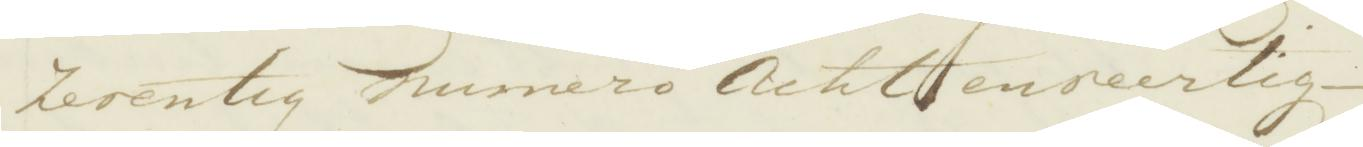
zeventig numero Acht en veertig_
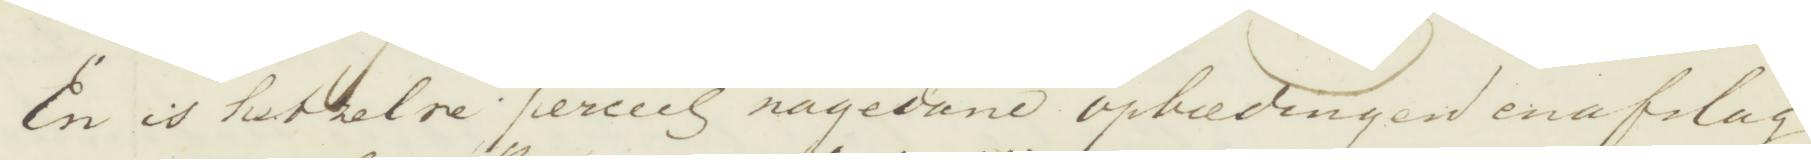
En is het zelve perceel nagedane opbiedingen en afslag
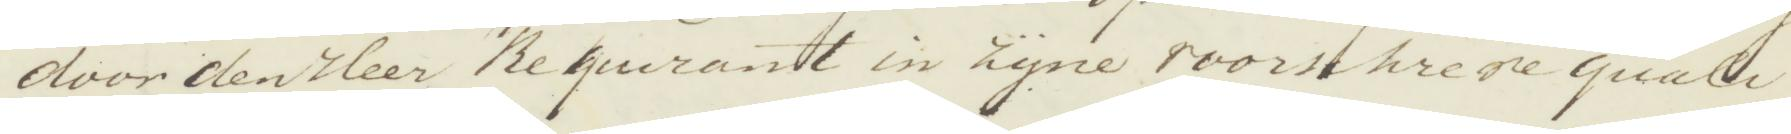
door den Heer Requirant in zijne voorschreve quali
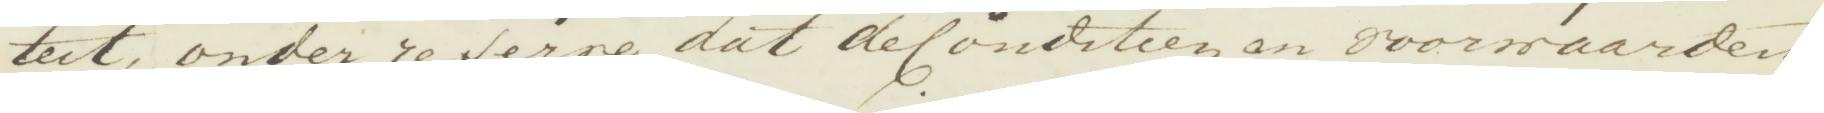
teit, onder reserve dat de conditien en voorwaarden
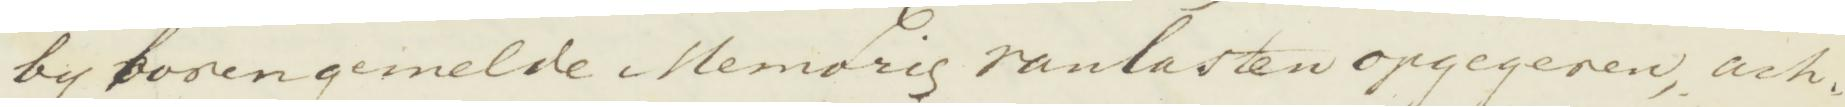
by bovengemelde Memorie van lasten opgegeven, ach„
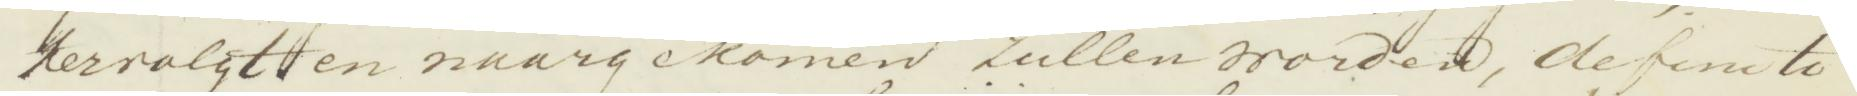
tervolgt en naargekomen zullen worden, definiti
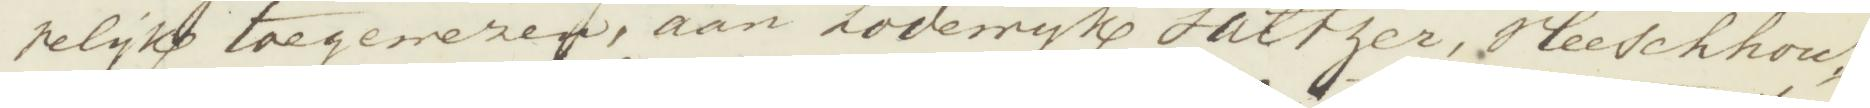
velijk toegewezen, aan Lodewyk Saltzer, Vleeschhou„
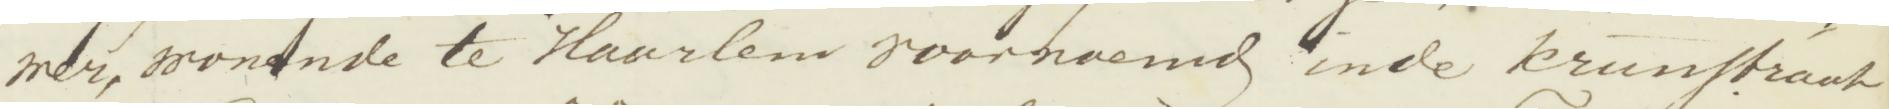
wer, wonende te Haarlem voornoemd in de kruisstraat
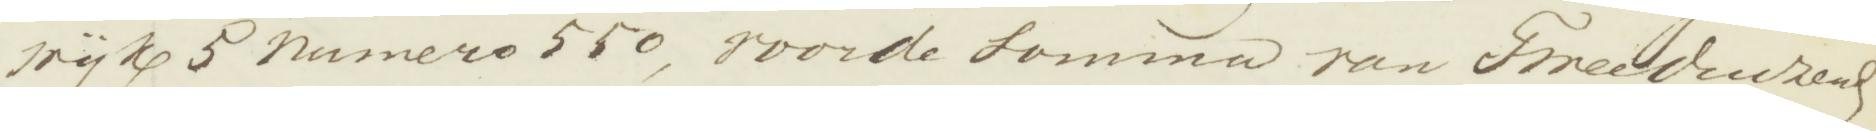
wijk 5 numero 550, voor de somma van Twee duizend
